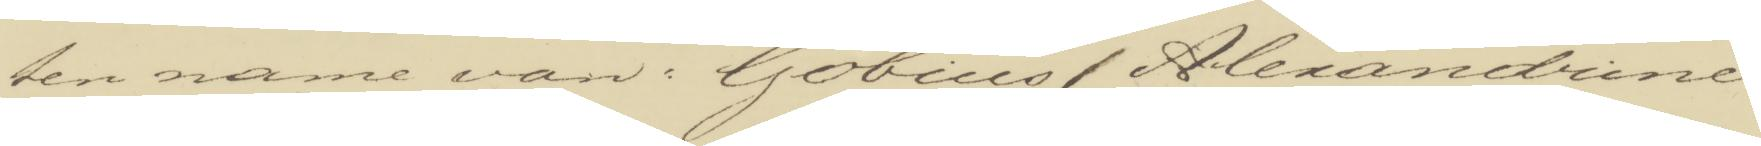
ten name van: Gobius/ Alexandrine
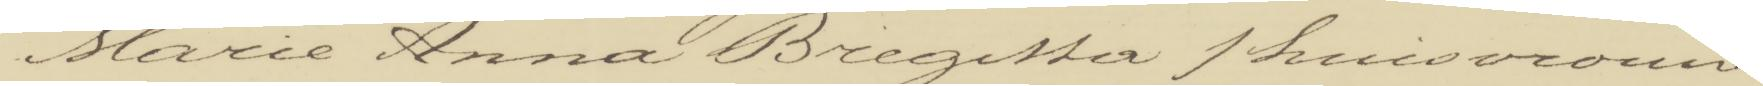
Marie Anna Bregitta /huisvrouw
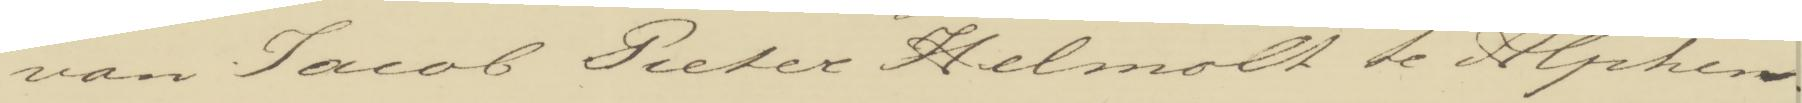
van Jacob Pieter Helmolt te Alphen
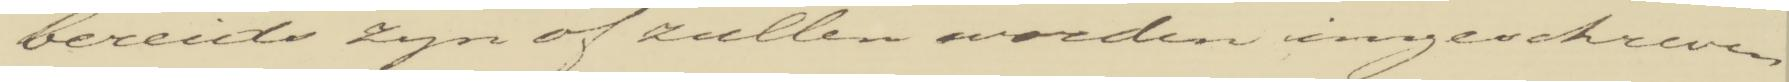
bereids zyn of zullen worden ingeschreven
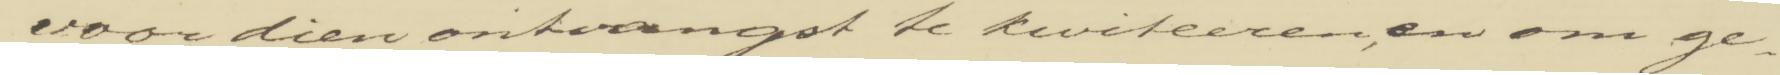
voor dien ontvangst te kwiteeren, en om ge„
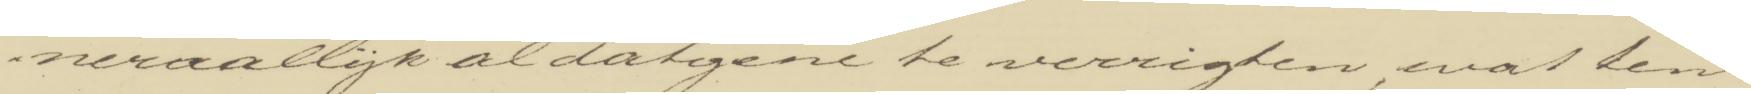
„neraallijk al datgene te verrigten, wat ten
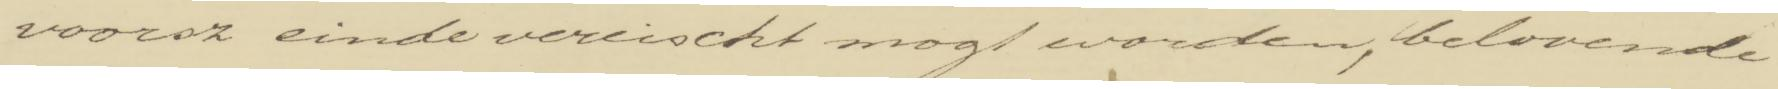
voorsz einde vereischt mogt worden, belovende
